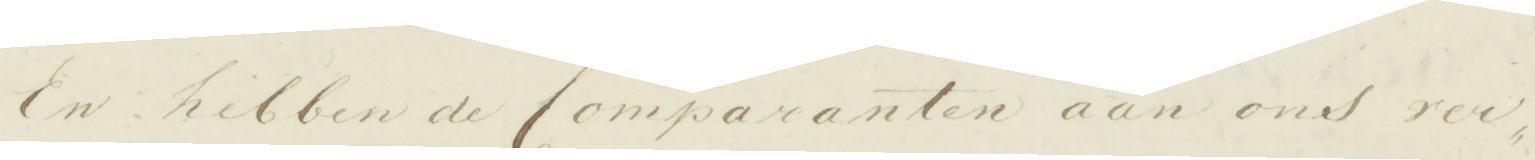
En hebben de Comparanten aan ons ver„
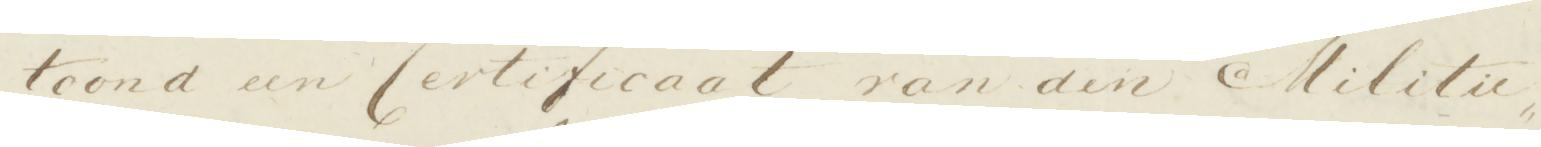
toond een Certificaat van den Militie„
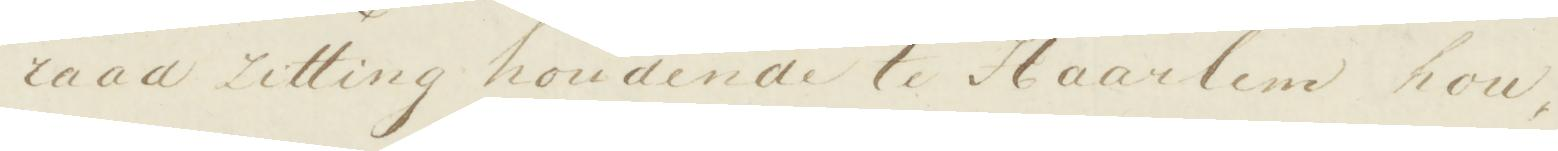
raad zitting houdende te Haarlem hou„
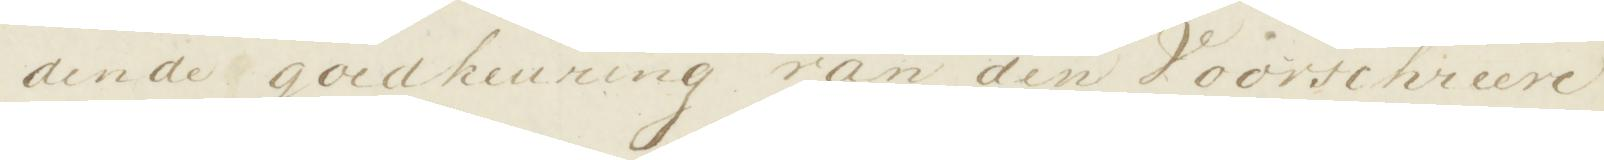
dende goedkeuring van den Voorschreeve
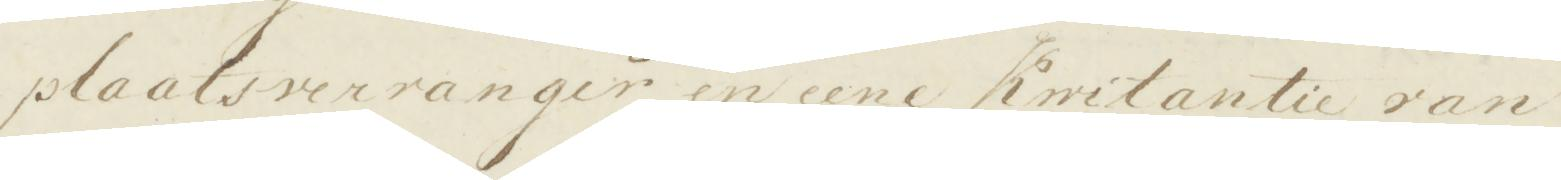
plaatsvervanger en eene Kwitantie van
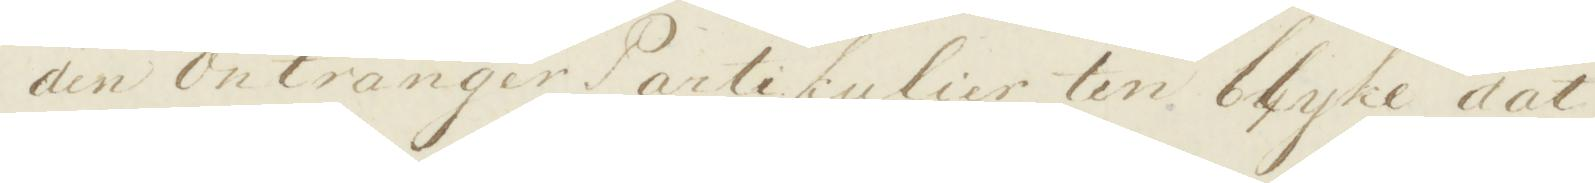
den Ontvanger Partikulier ten blyke dat
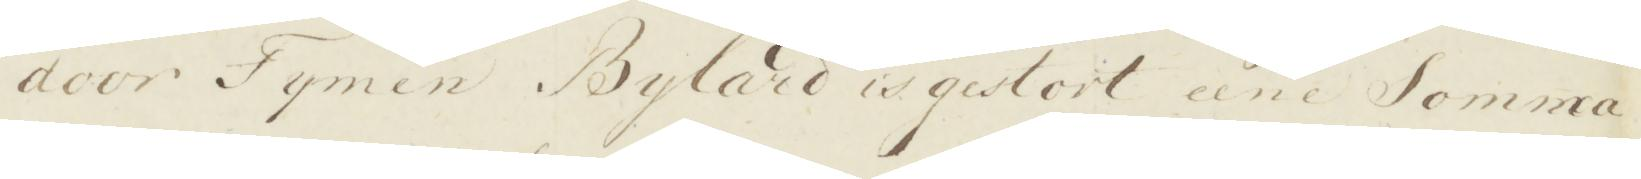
door Tymen Bylard is gestort eene somma
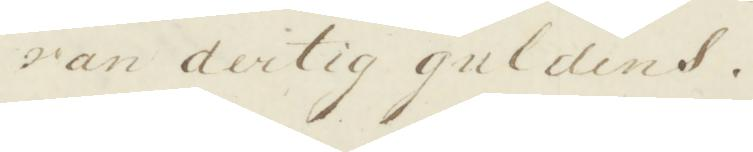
van dertig guldens.
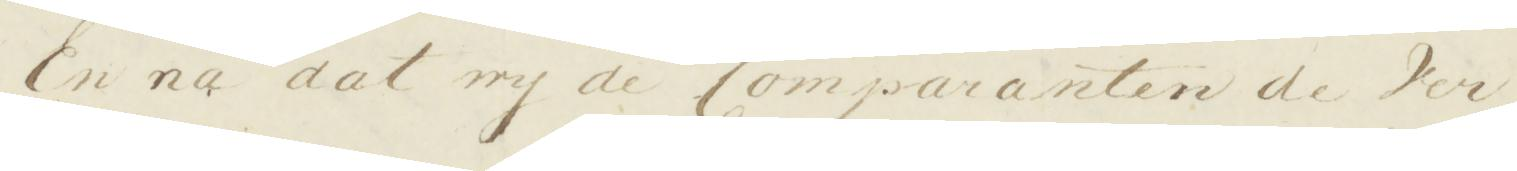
En na dat wy de Comparanten de ver
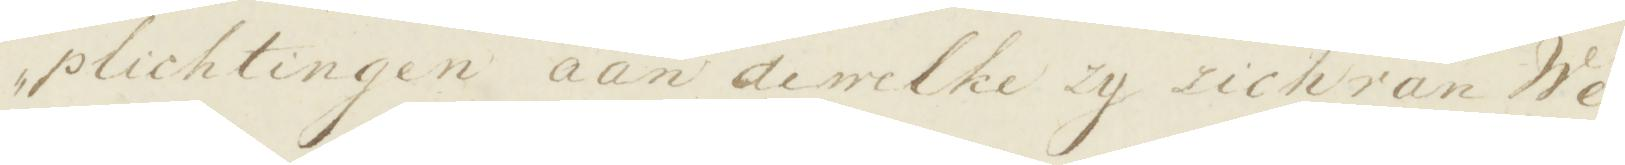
„plichtingen aan dewelke zy zich van We
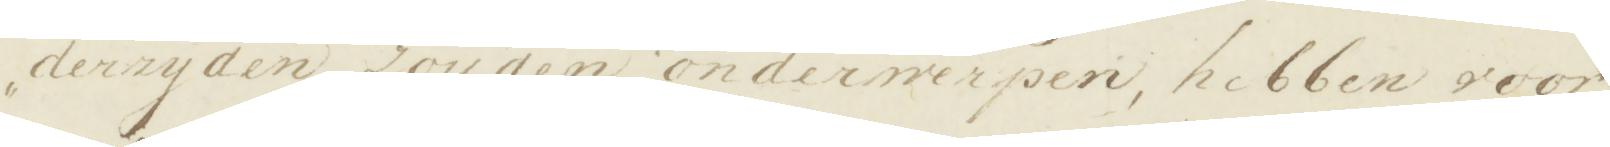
„derzyden zouden onderwerpen, hebben voor
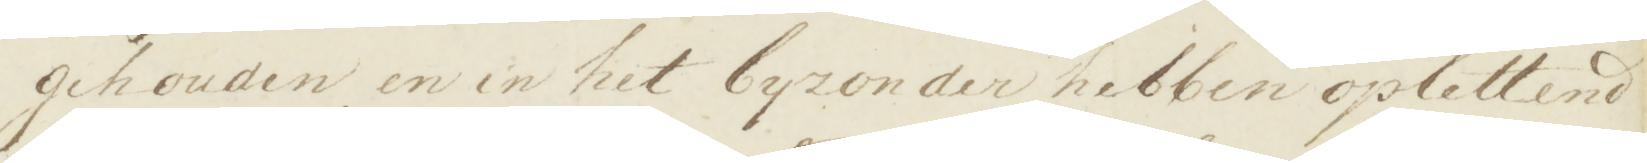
gehouden, en in het byzonder hebben oplettend
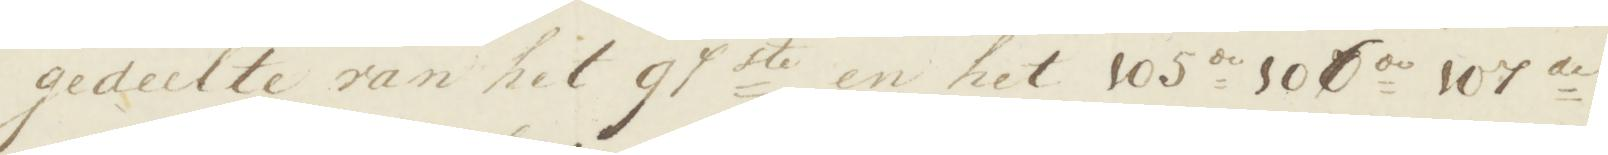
gedeelte van het 97=ste en het 105=de 106=de 107=de
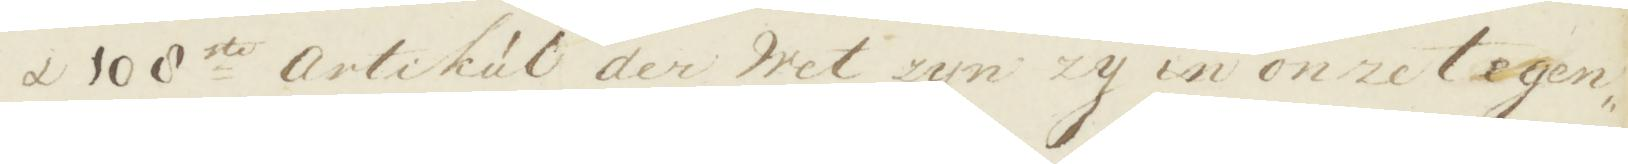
& 108=e artikul der Wet zyn zy in onze tegen„
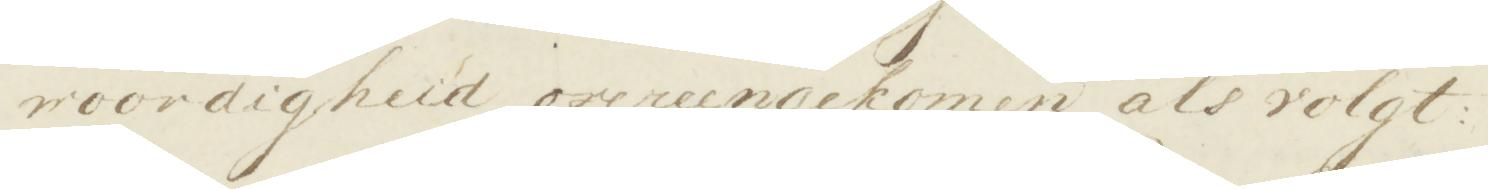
woordigheid overeengekomen als volgt:
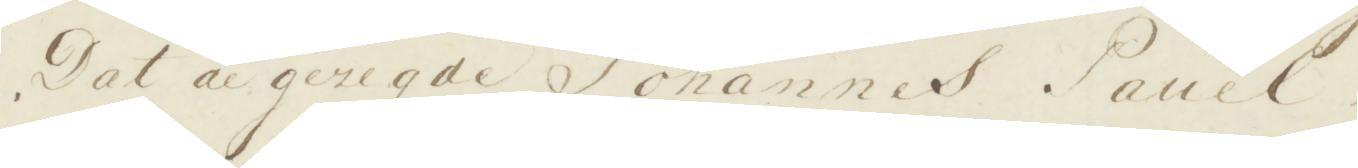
, Dat de gezegde Iohannes Pauel
